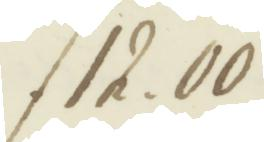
ƒ12.00
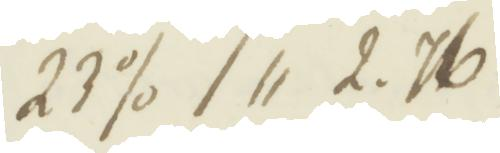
23% „ 2.76
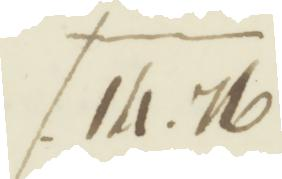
ƒ 14.76
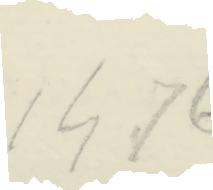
14.76
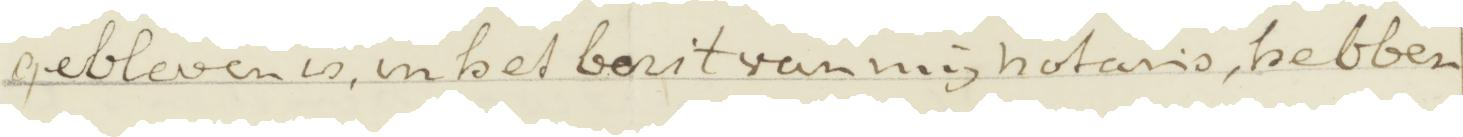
gebleven is, in het bezit van mij notaris, hebben
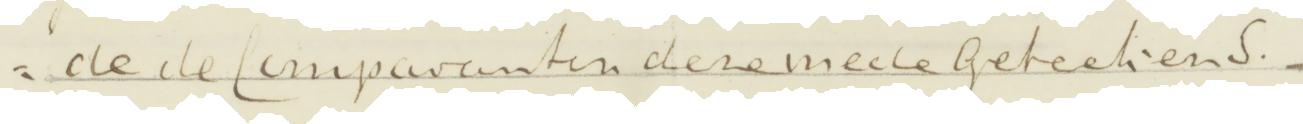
=de de Comparanten deze mede geteekend.
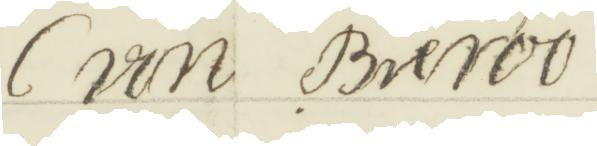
C van Brevoo
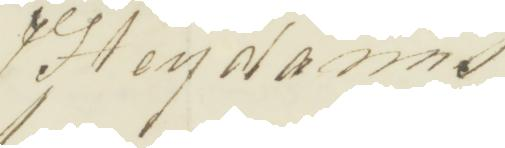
J Heydams
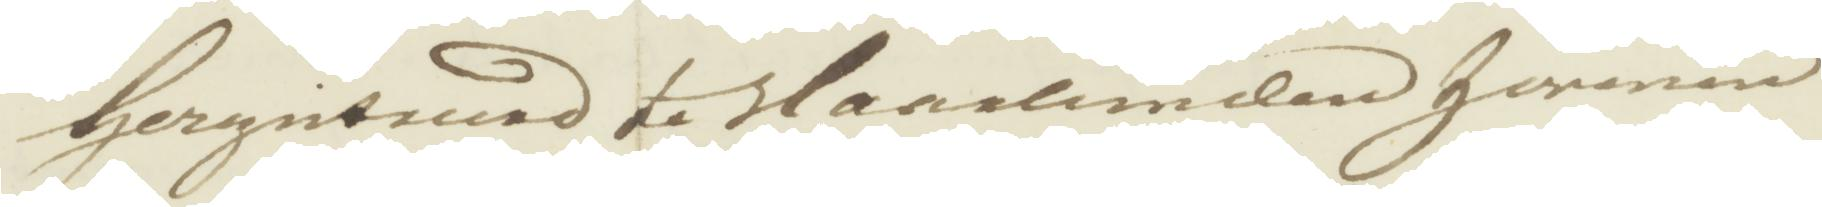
Geregistreerd te Haarlem den Zevenen
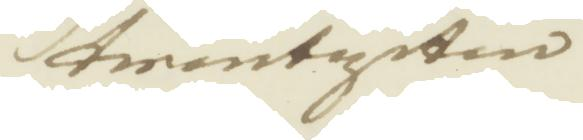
twintigsten September 1800 agtendertig
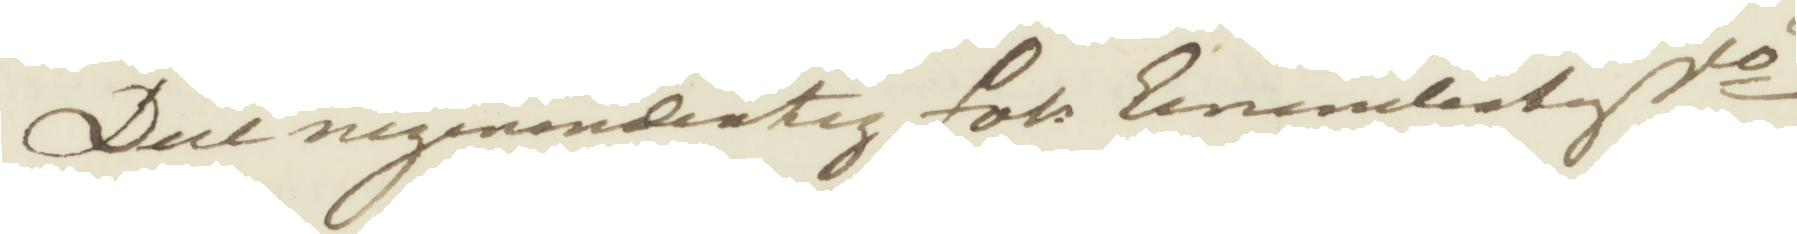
Deel negenendertig fol.o Eenendertig V=o
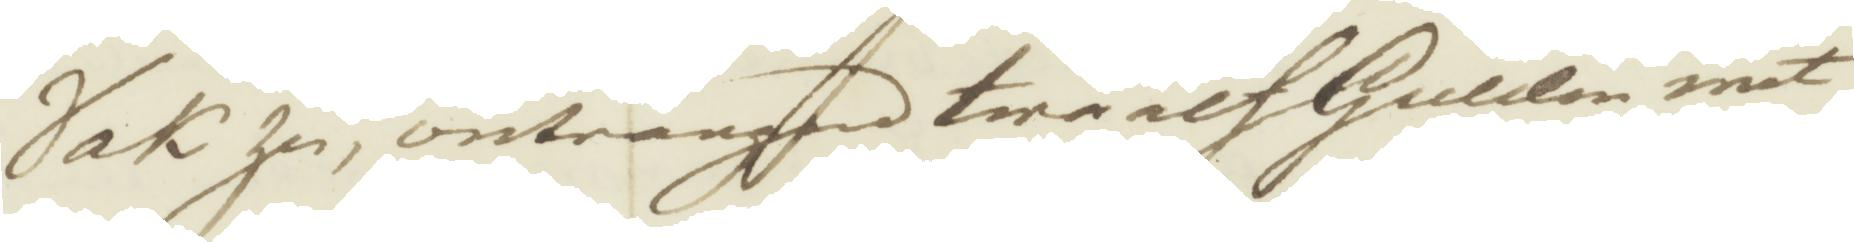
Vak Zes, ontvangen twaalf Gulden met
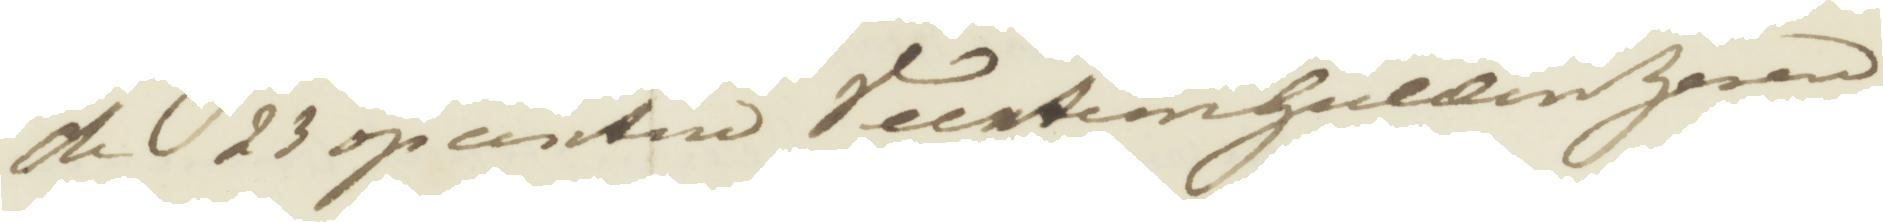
de 23 opcenten Veertien Gulden Zesen
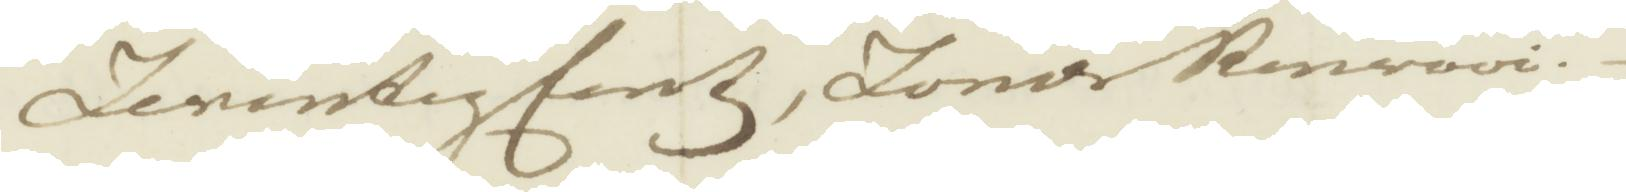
Zeventig Cent, Zonder Renvooi.
